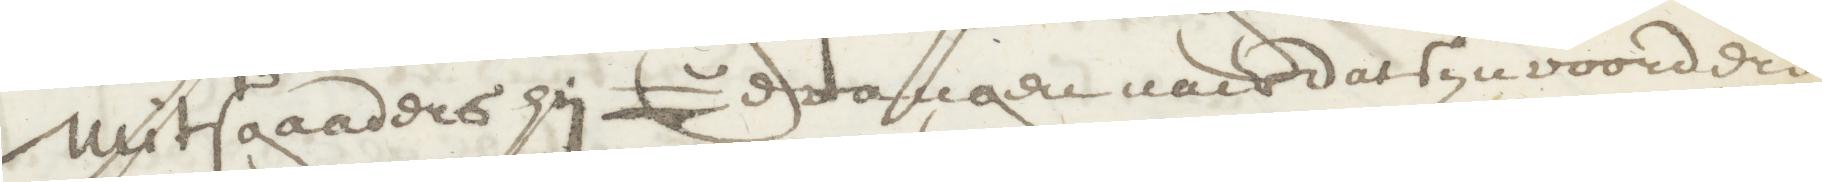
mitsgaaders hij Gevangen naer dat syn voordere
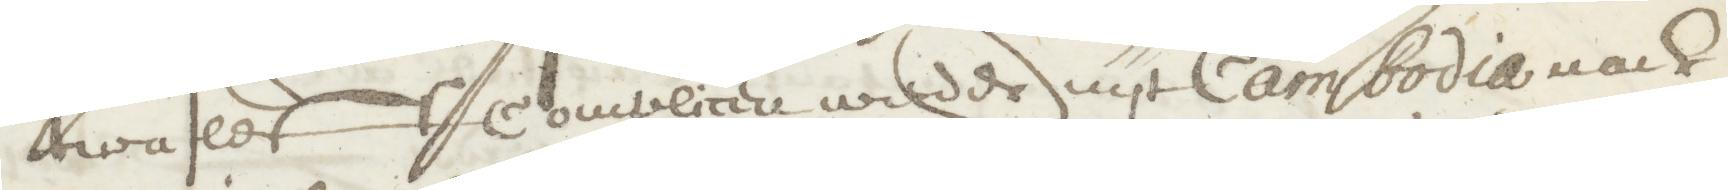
twaleff complicen weder uijt Cambodia naer
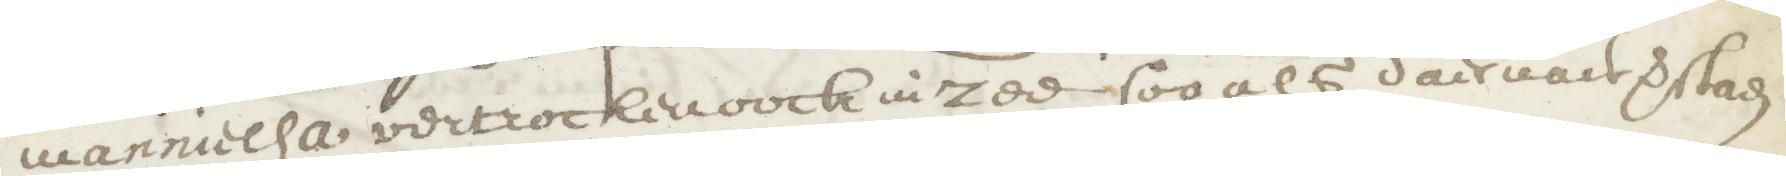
mannielha vertrocken in zee soo als daernaer verstaen
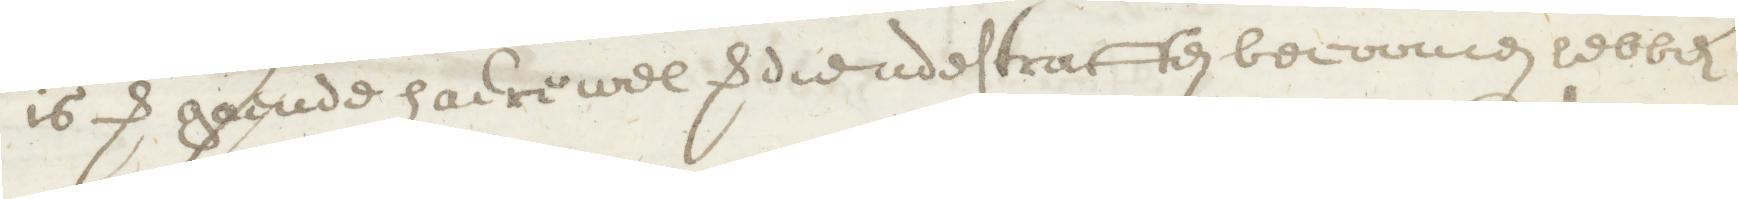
is vergaende haere wel verdiende straffen becoomen hebben
